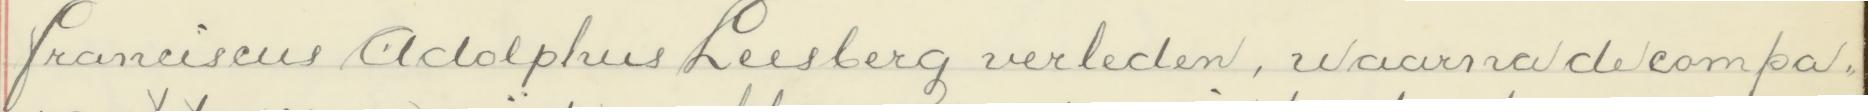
franciscus Adolphus Leesberg verleden, waarna de compa„
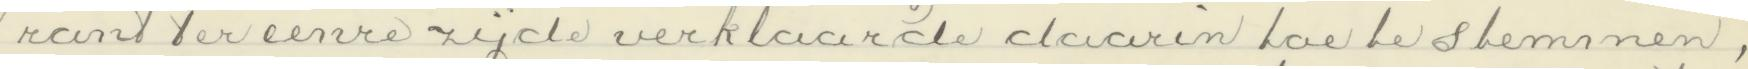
rant ter eenre zijde verklaarde daarin toe te stemmen
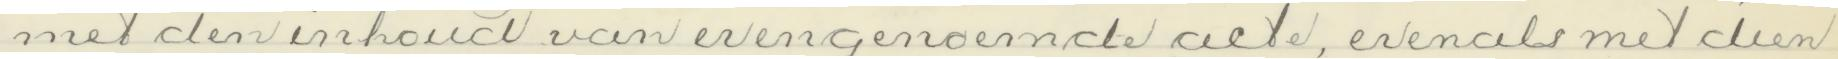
met den inhoud van evengenoemde acte, even als met dien
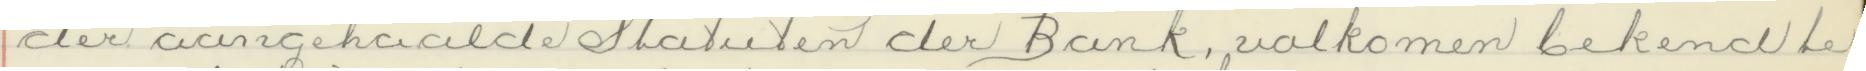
der aangehaalde statuten der Bank, volkomen bekend te
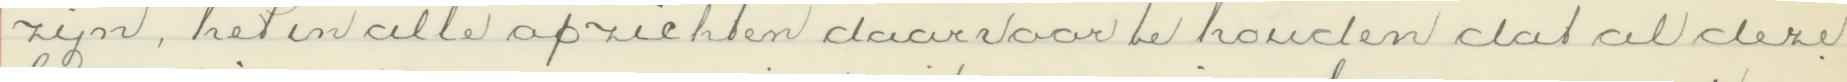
zyn, het in alle opzichten daarvoor te houden dat al deze
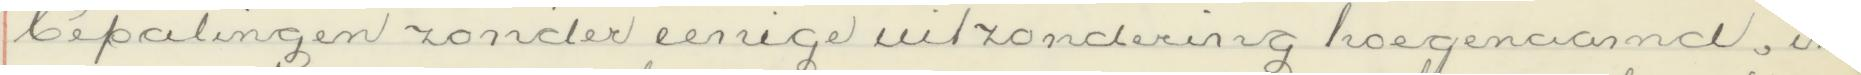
bepalingen zonder eenige uitzondering hoegenaamd, in
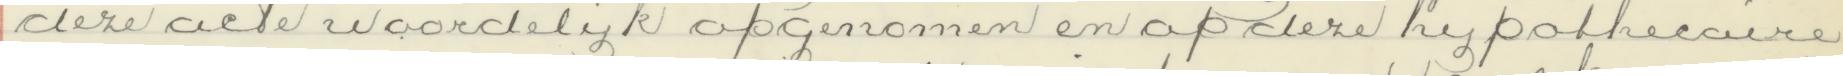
deze acte woordelijk opgenomen en op deze hypothecaire
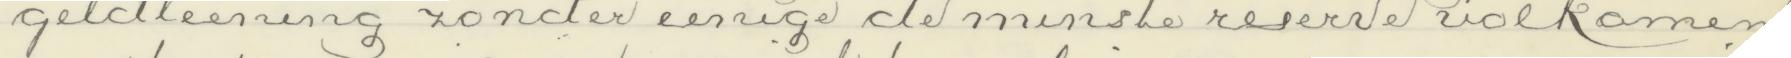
geldleening zonder eenige de minste reserve volkomen
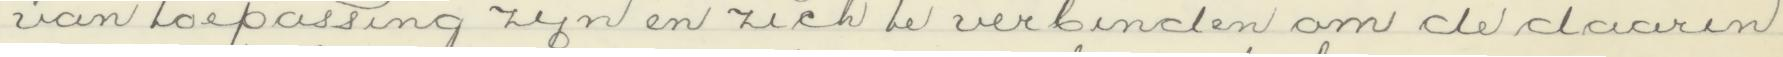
van toepassing zyn en zich te verbinden om de daarin
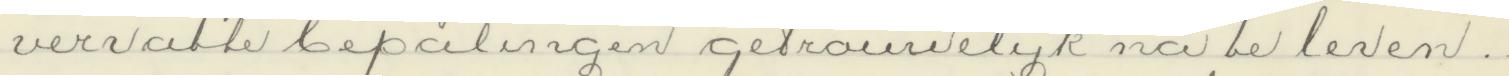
vervatte bepalingen getrouwelijk na te leven.
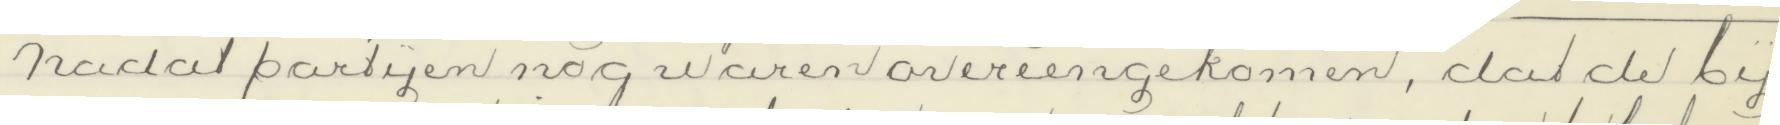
nadat partijen nog waren overeengekomen, dat de bij
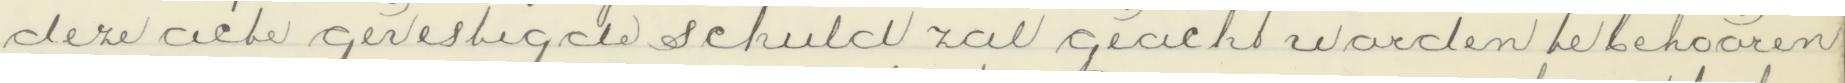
deze acte gevestigde schuld zal geacht worden te behooren
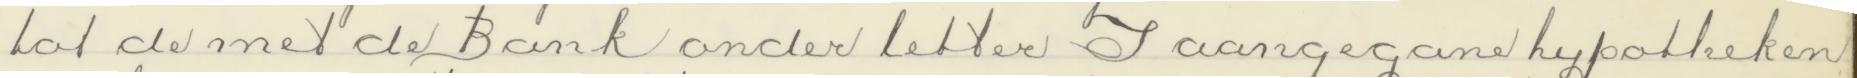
tot de met de Bank onder letter S aangegane hypotheken
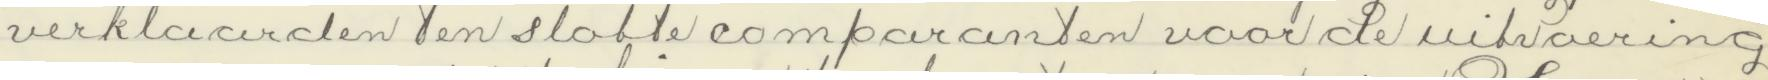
verklaarden ten slotte comparanten voor de uitvoering
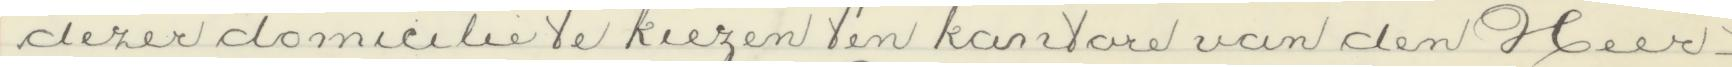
dezer domicilie te kiezen ten kantore van den Heer
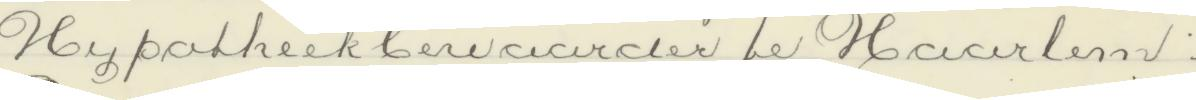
Hypotheek bewaarder te Haarlem
